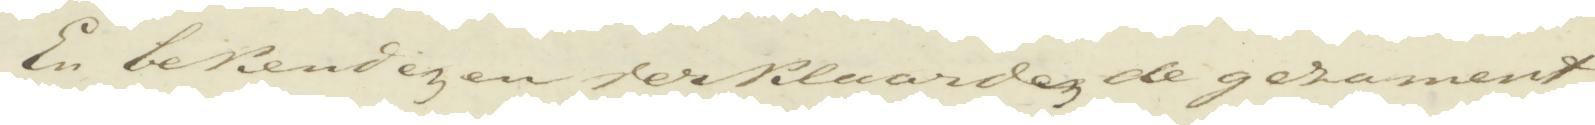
En beken dezen verklaarden de gezament
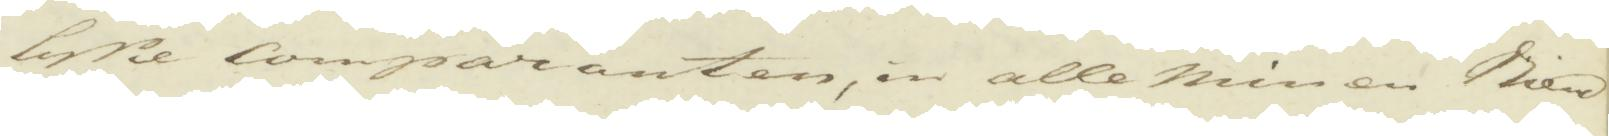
lyke comparanten, in alle min en Vriend
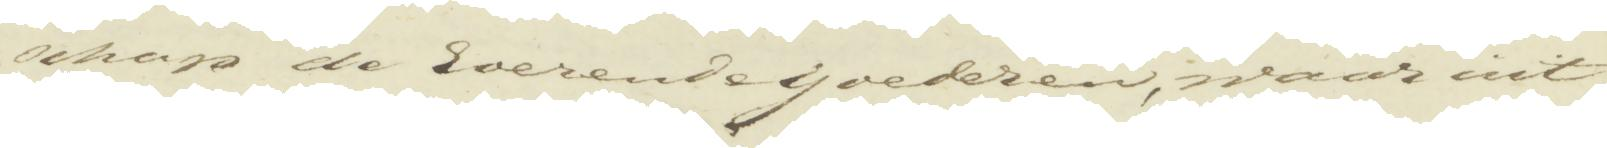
schap de roerende goederen, waar uit
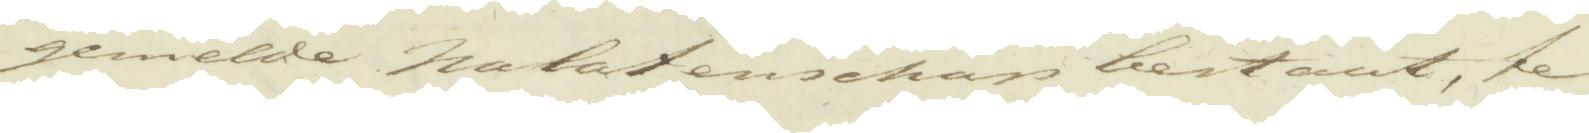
gemelde Nalatenschap bestaat, te
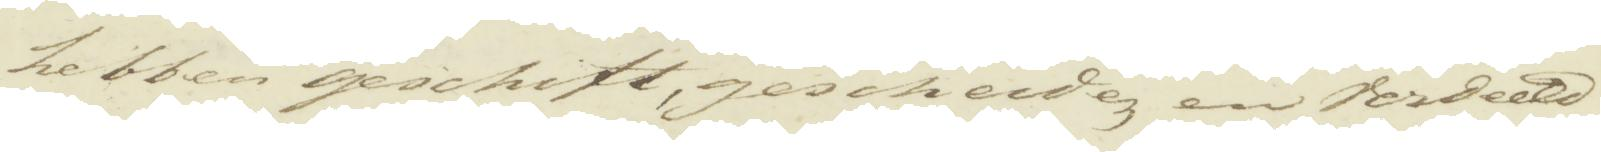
hebben geschift, gescheiden en verdeeld
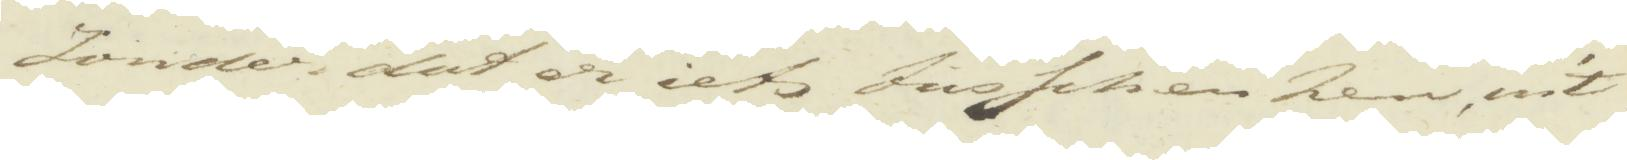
zonder dat er iets tusschen hen, in't
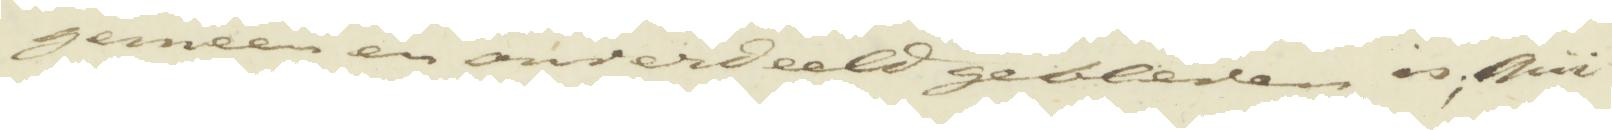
gemeen en onverdeeld gebleven is; Qui
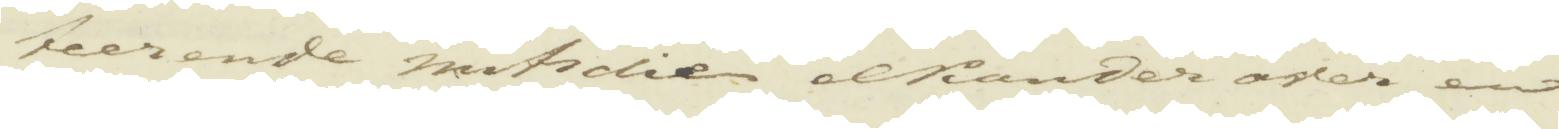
teerende mitsdien elkander over en
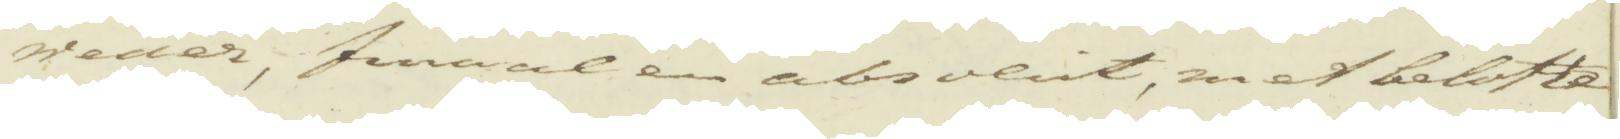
weder, finaal en absolut, met belofte
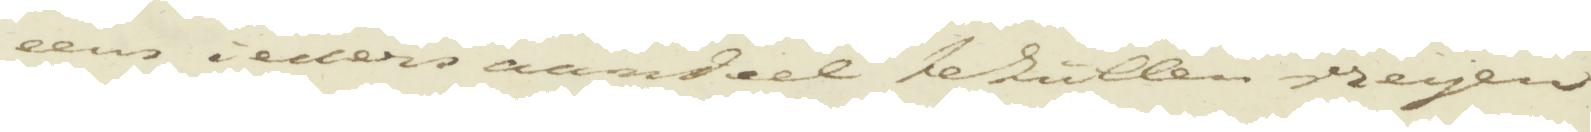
eens ieders aandeel te zullen vreijen
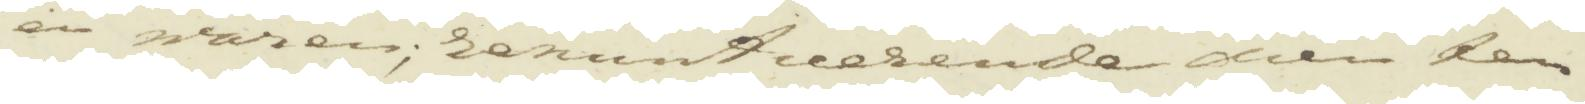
en waren; renuntieerende dien ten
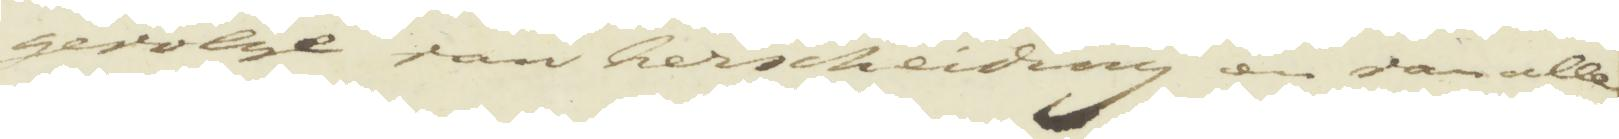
gevolge van herscheiding en van alle
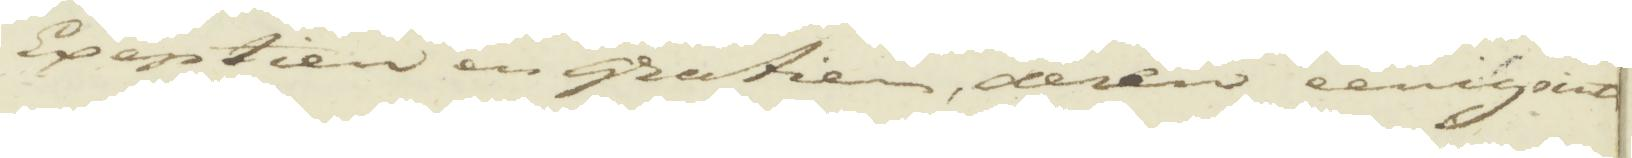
Exeptien en gratien, dezen eenigsint
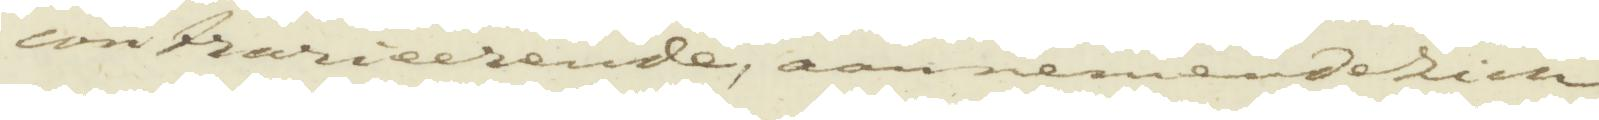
contrarieerende, aannemende zich
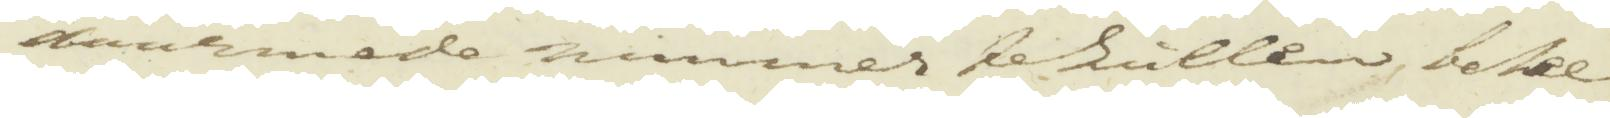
daarmede nimmer te zullen behel
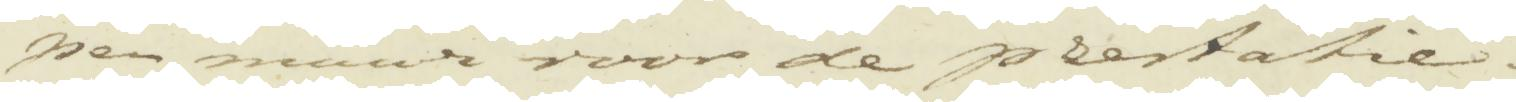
pen, maar voor de prestatie en
